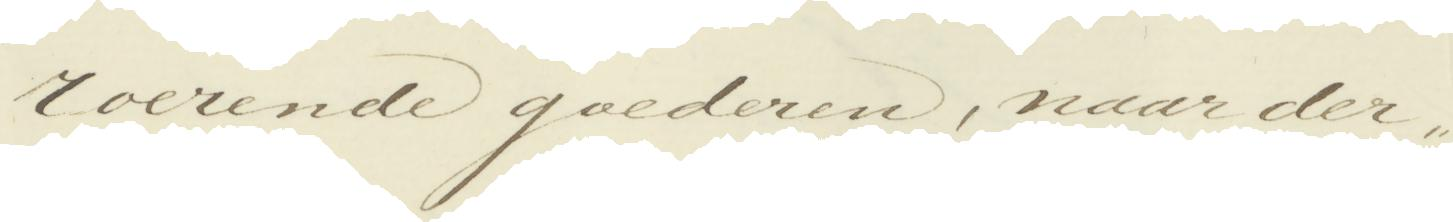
roerende goederen, naar der„
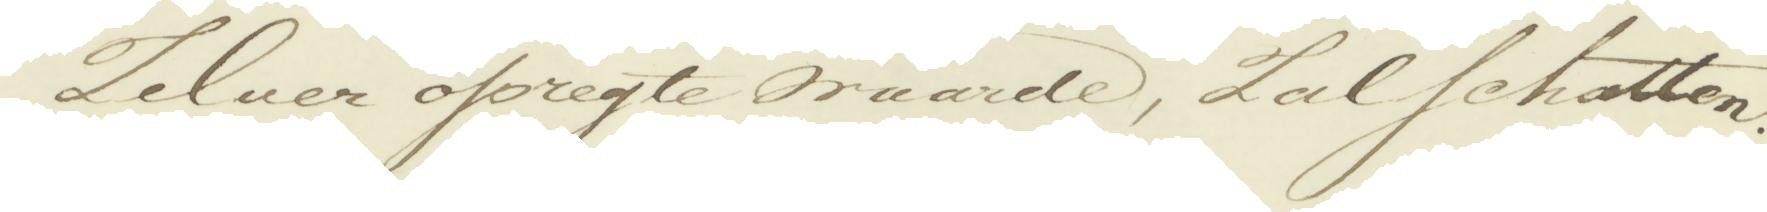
zelver opregte waarde, zal schatten
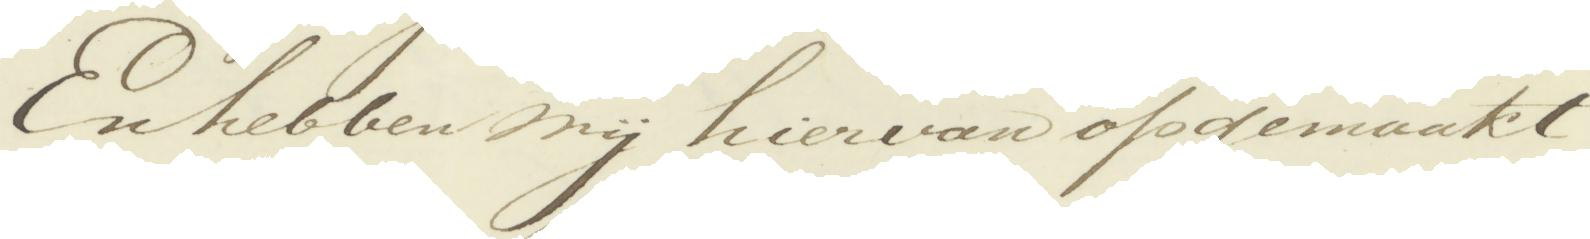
En hebben mij hier van op gemaakt
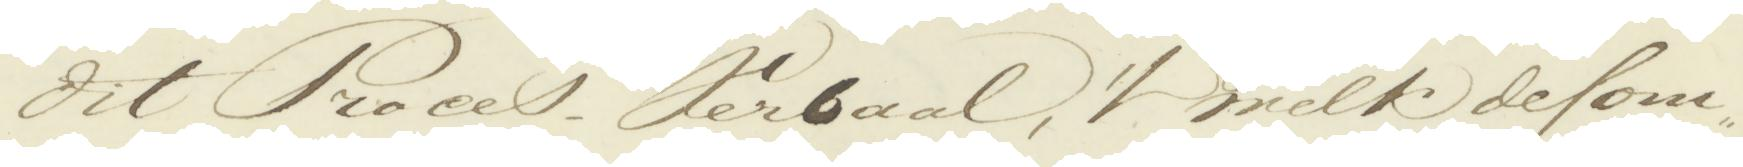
dit Proces-Verbaal, 't welk de Com„
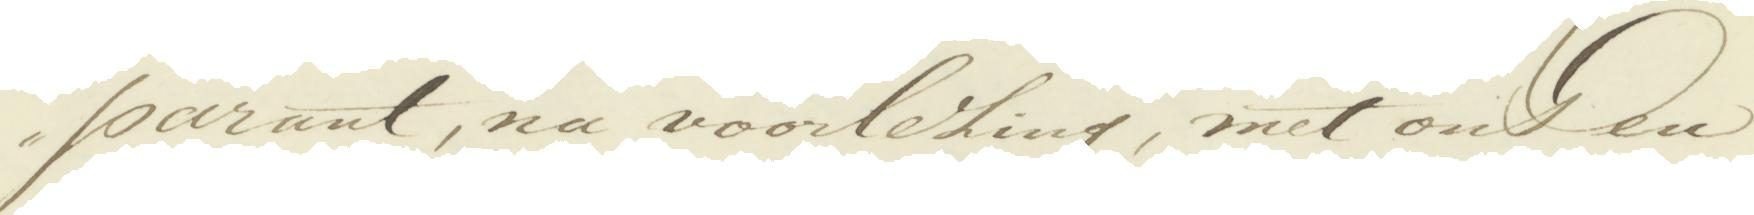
„parant, na voorlezing, met ons en
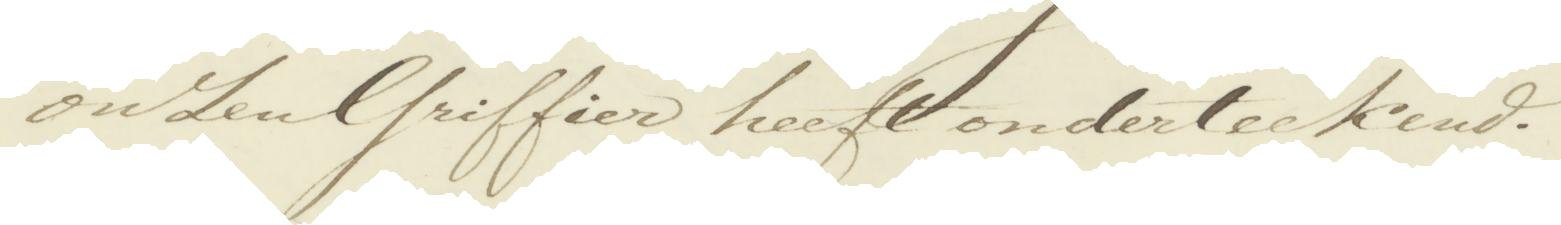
onzen Griffier heeft onderteekend.
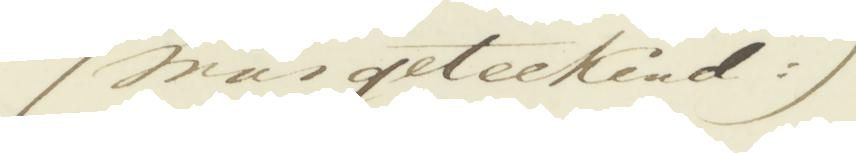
(was geteekend :)
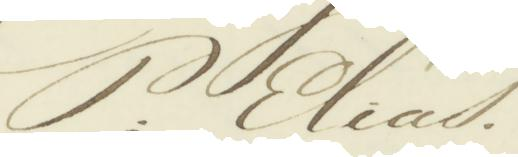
P: Elias.
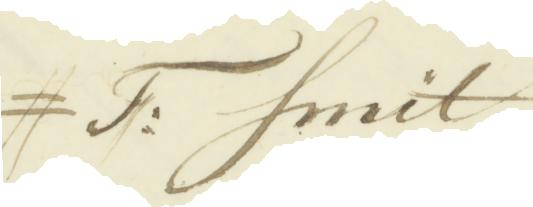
# F: Smit.
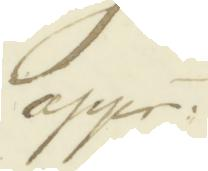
appr:
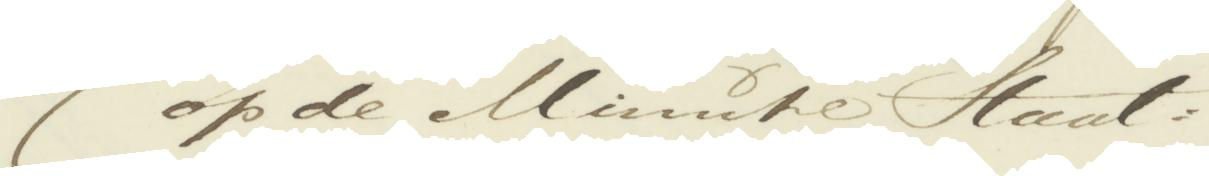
(op de Minute staat:)
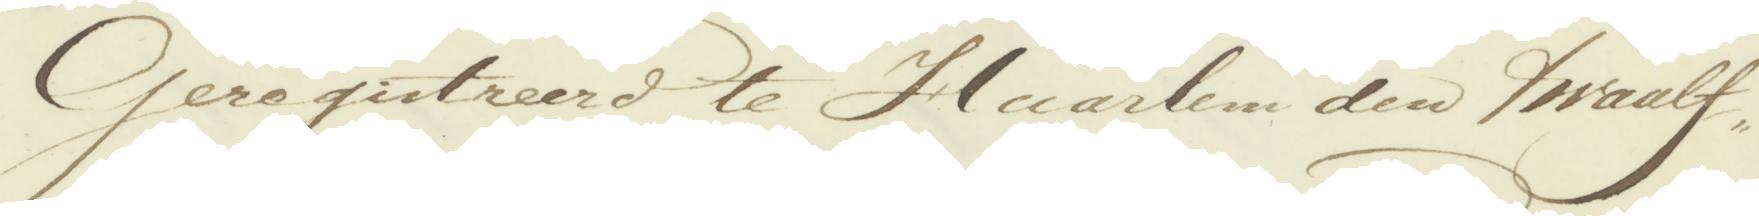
Geregistreerd te Haarlem den twaalf„
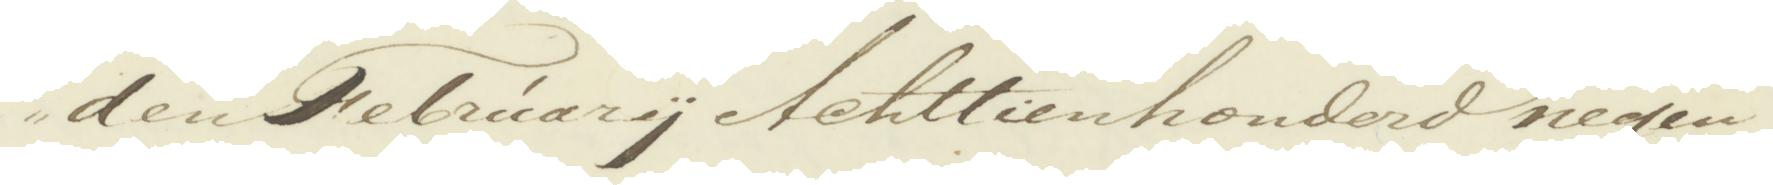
„den Februarij Achttienhonderd negen
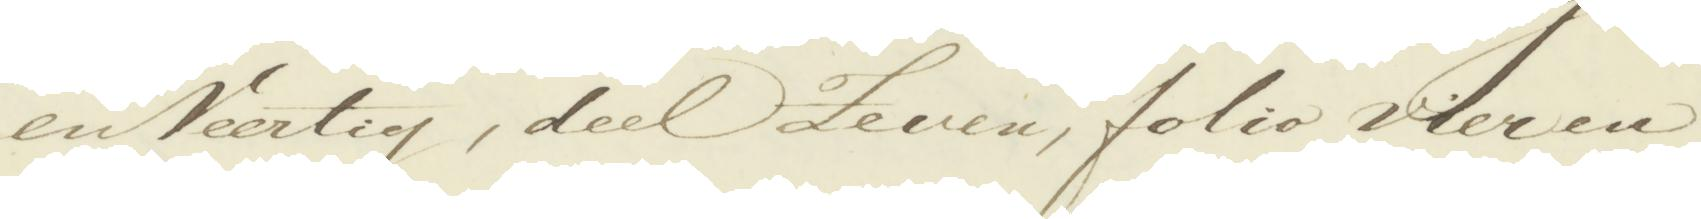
en Veertig, deel Zeven, folio vier en
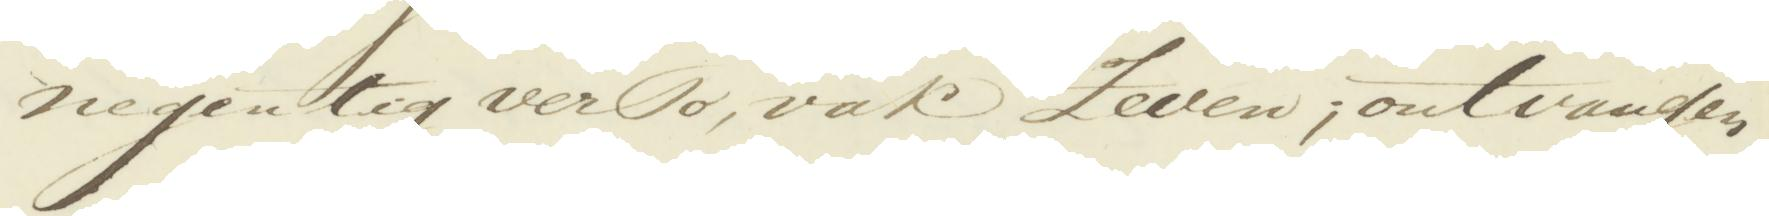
negentig verso, vak Zeven; ontvangen
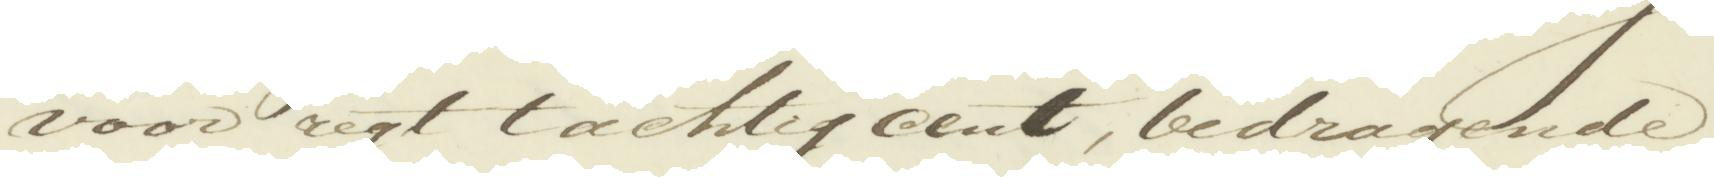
voor regt tachtig cent, bedragende
